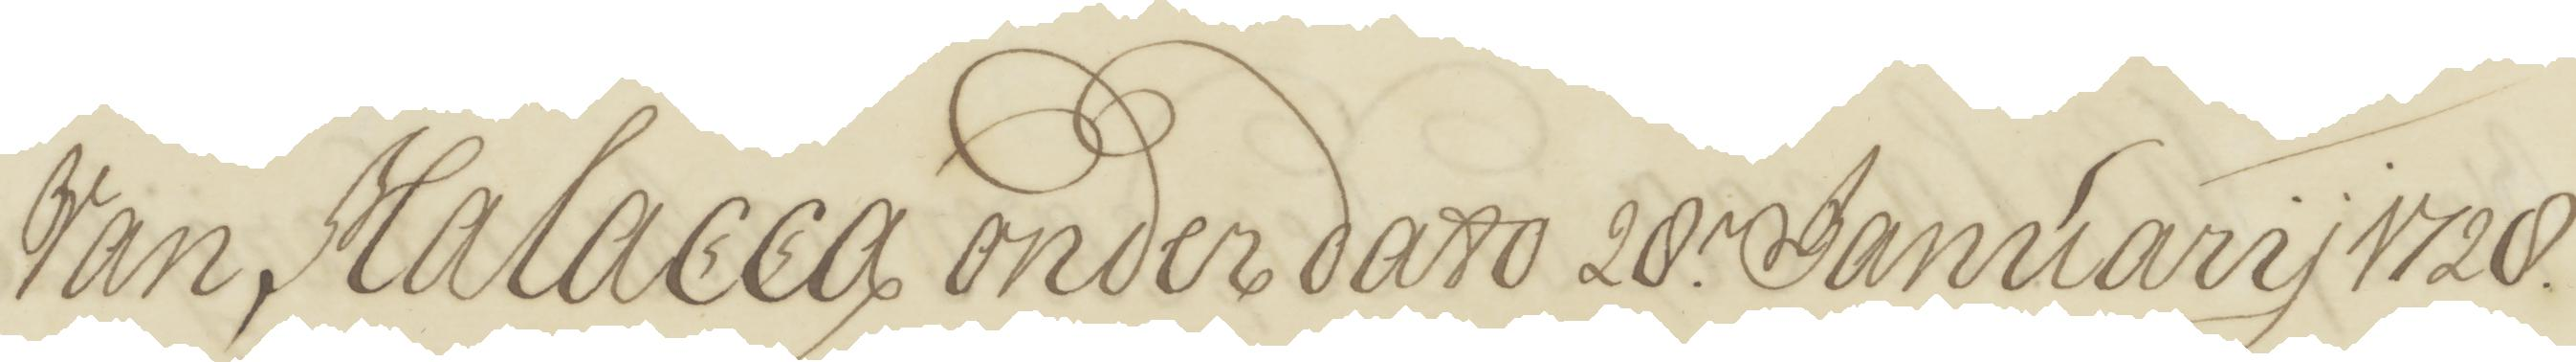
Van Malacca onder dato 28:n Ianuarij 1728.
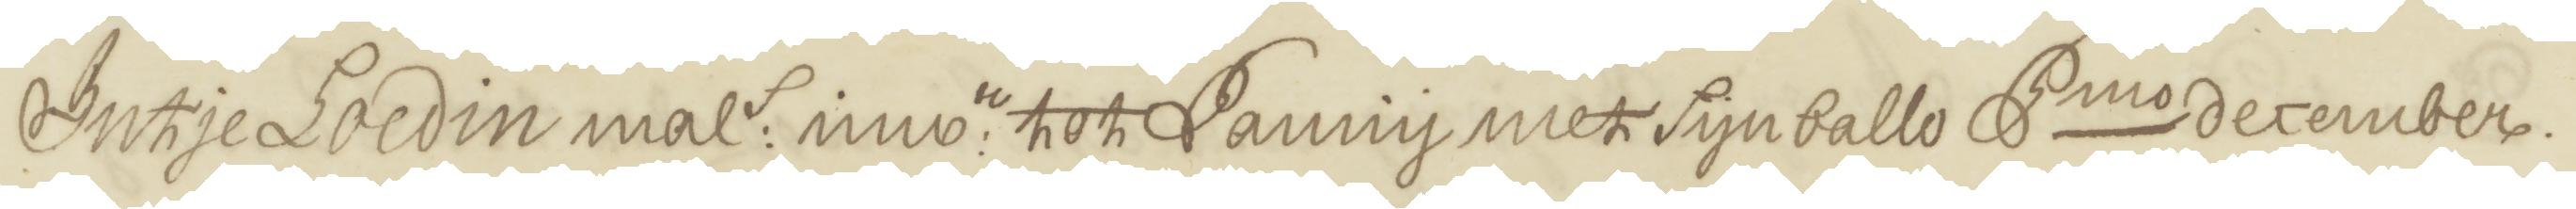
Intje Loedin mal:s inw:r tot Pannij met sijn ballo P_mo december.
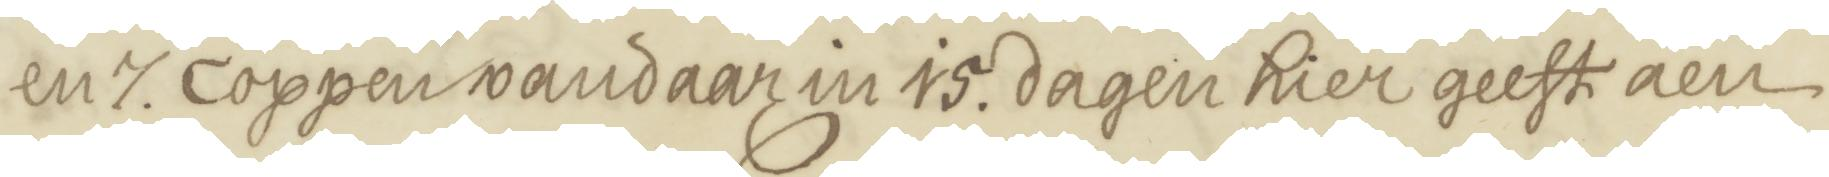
en 7. Coppen vandaar in 15. dagen hier geeft aen
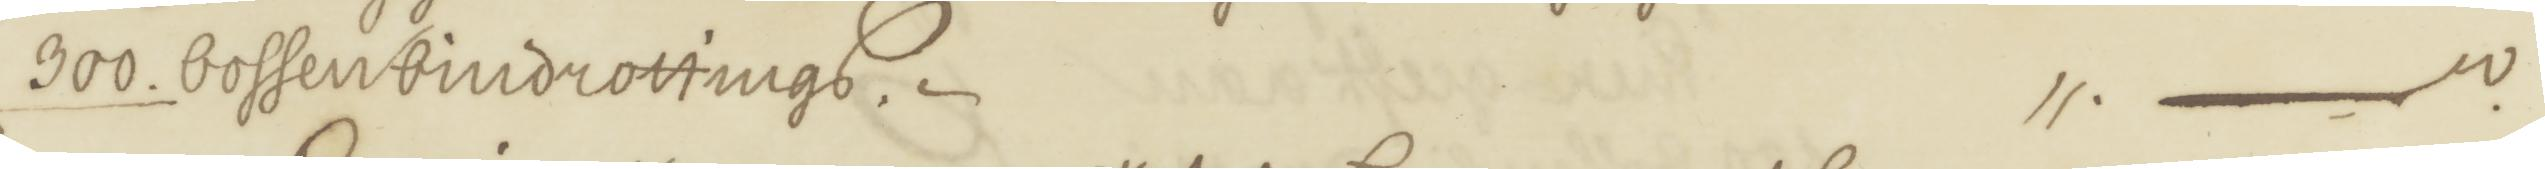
300. bossen bindrottings.- „. _.o
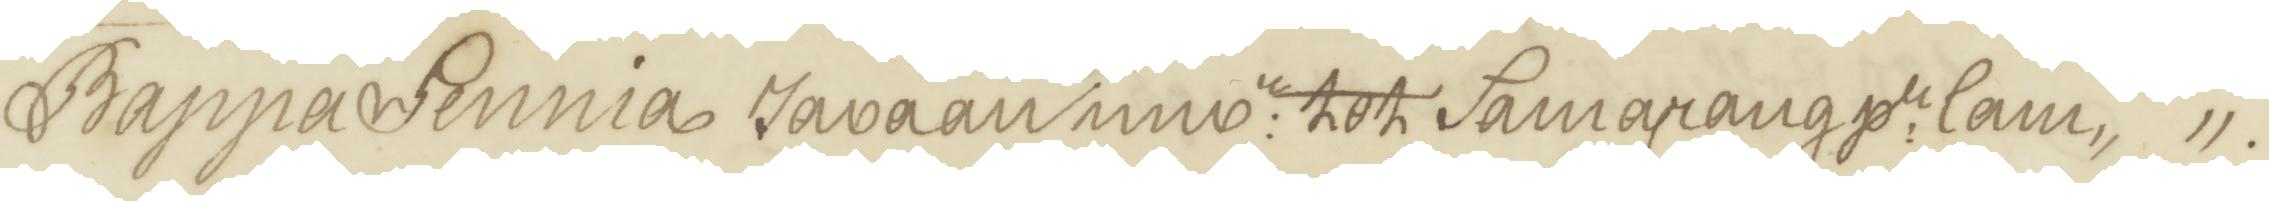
Bappa Sennia Javaan inw:r tot Samarang p:r lam„ „.
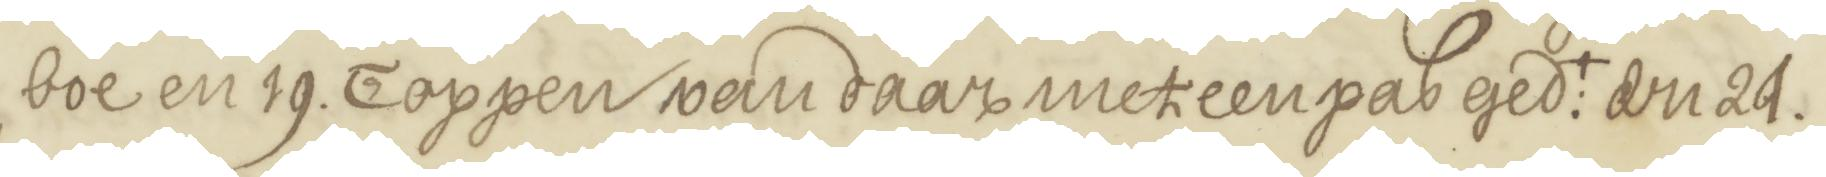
„boe en 19. Coppen van daar met een pas ged:t den 24.
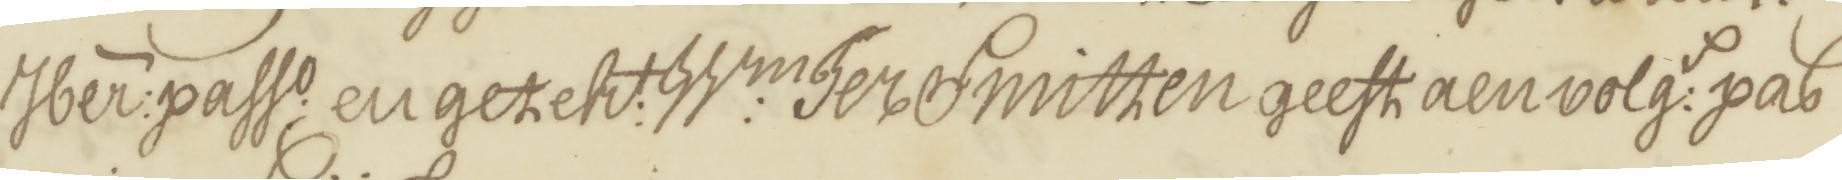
7ber: pass:o en getek:t W:m Ter Smitten geeft aen volg:s pas
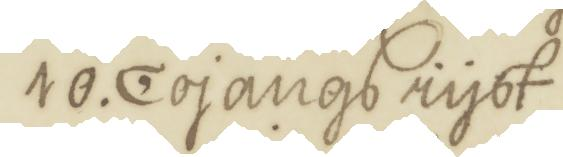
10. Cojangs rijst
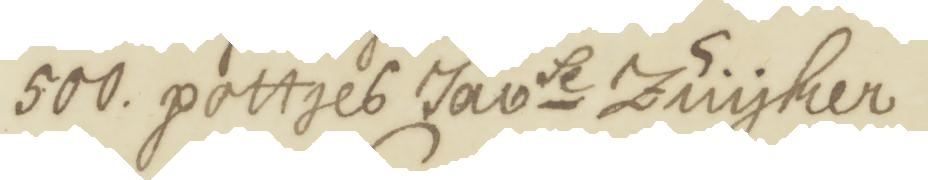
500. pottjes Jav=se zuijker
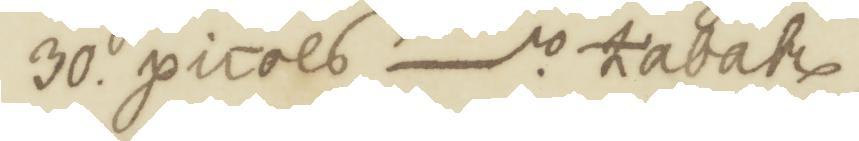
30. picols _.o tabak
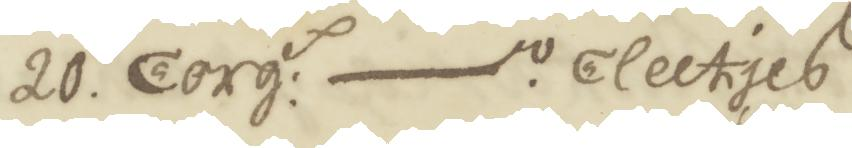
20. Corg:s _.o Cleetjes
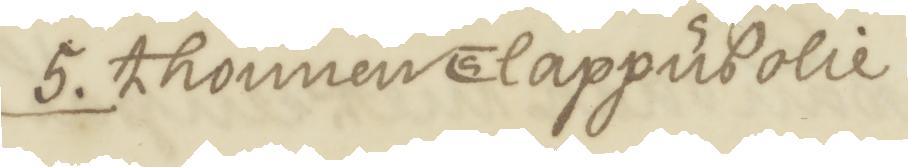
5. thonnen Clappus olie
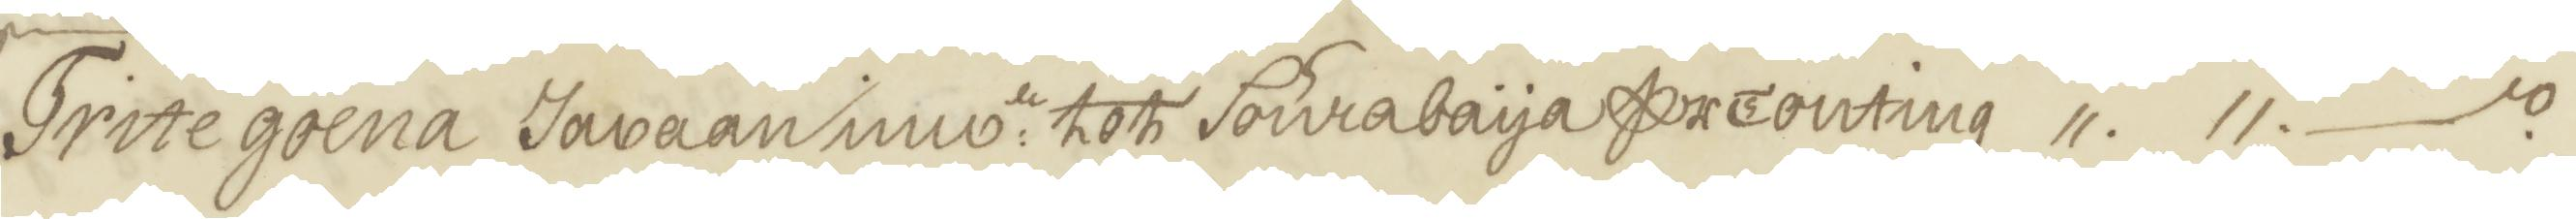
Trite goena Javaan inw:r tot sourabaija per Conting „. „. _.o
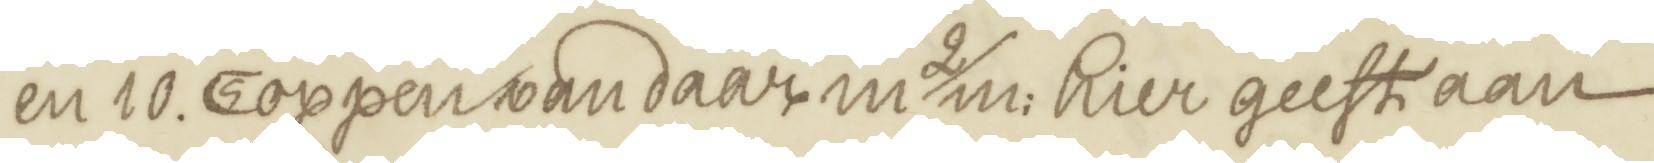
en 10. Coppen van daar in 2/m: hier geeft aan
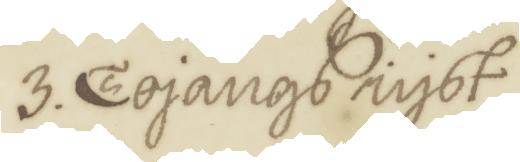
3. Cojangs rijst
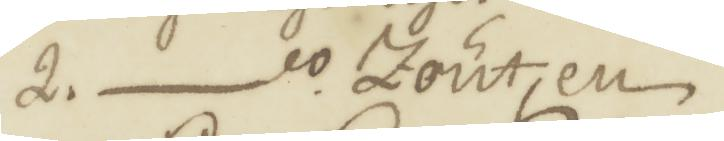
2. _.o zouten
